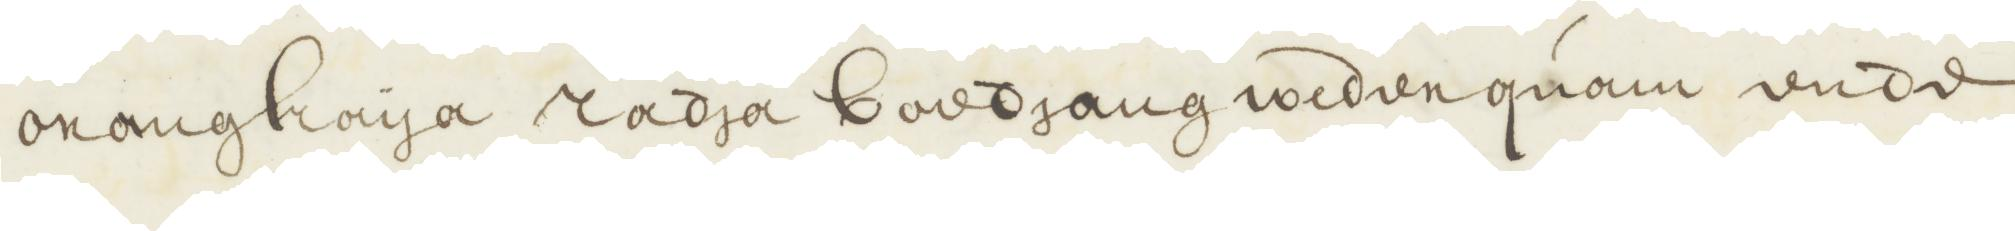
orangkaija radja boedjang weder quam ende
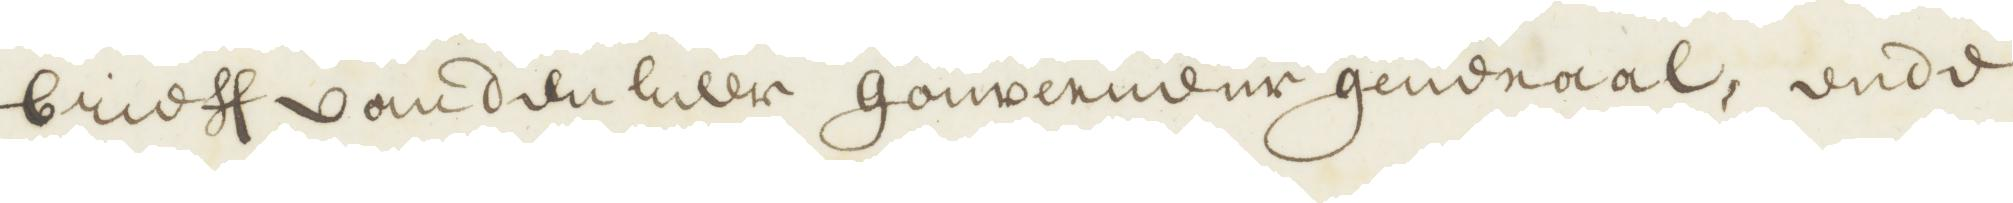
brieff van den heer gouverneur generaal, ende
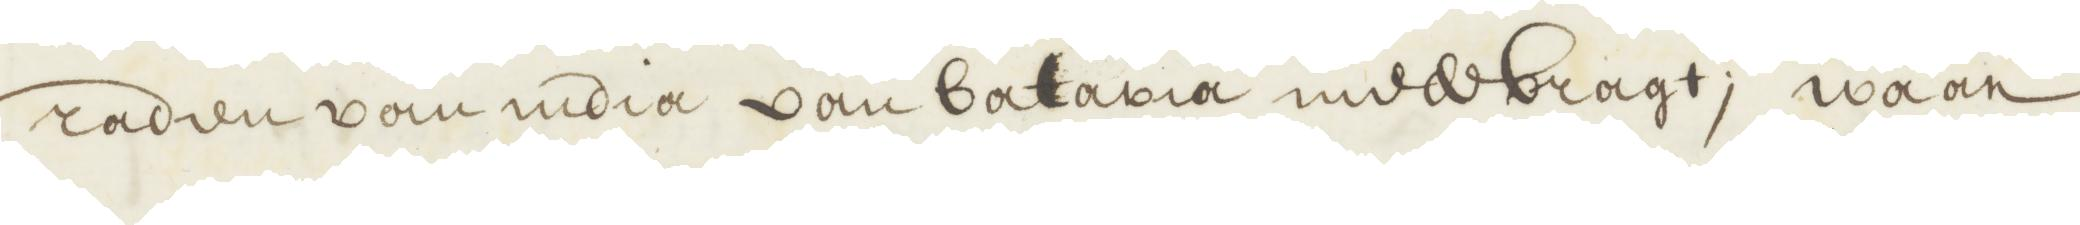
raden van india van batavia medebragt; waar
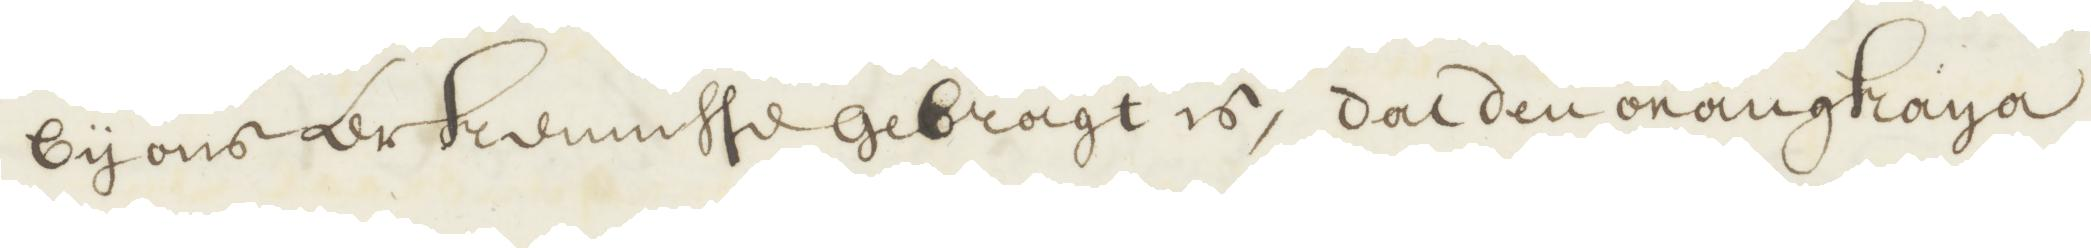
bij ons ter kennisse gebragt is, dat den orangkaija
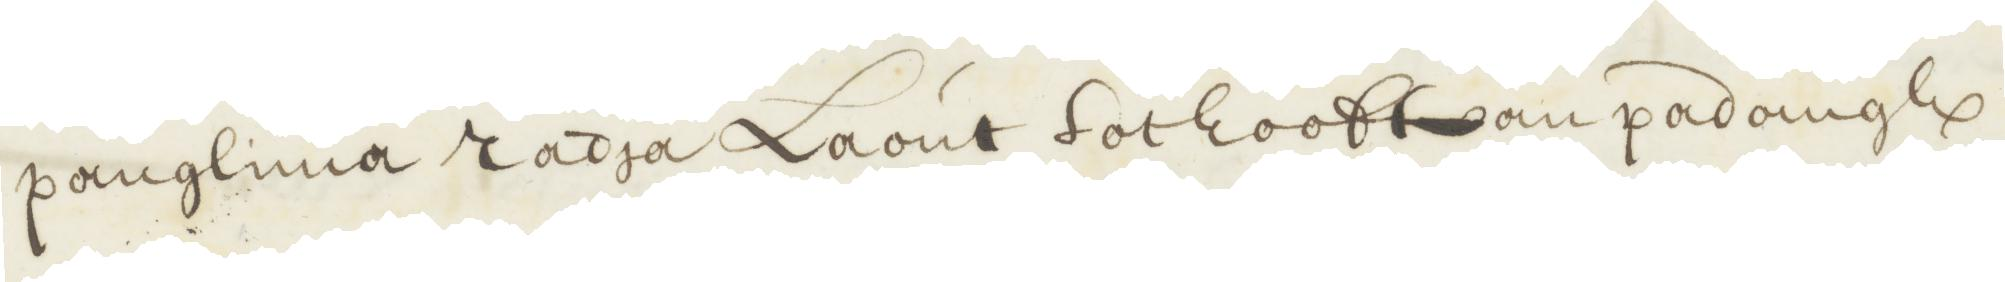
panglima radja Laout tothooftvan padangh
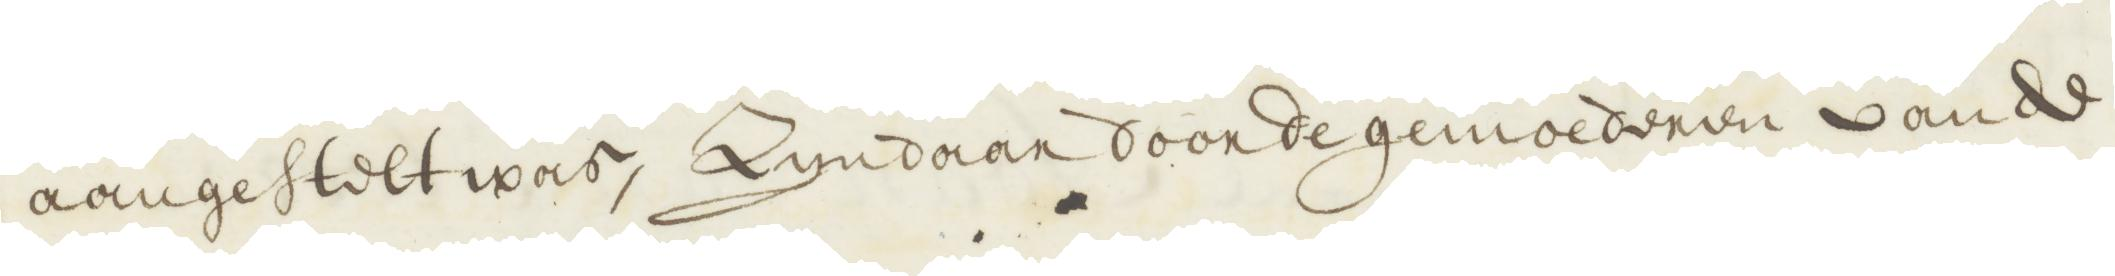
aangestelt was, zijn daar door de gemoederen van de
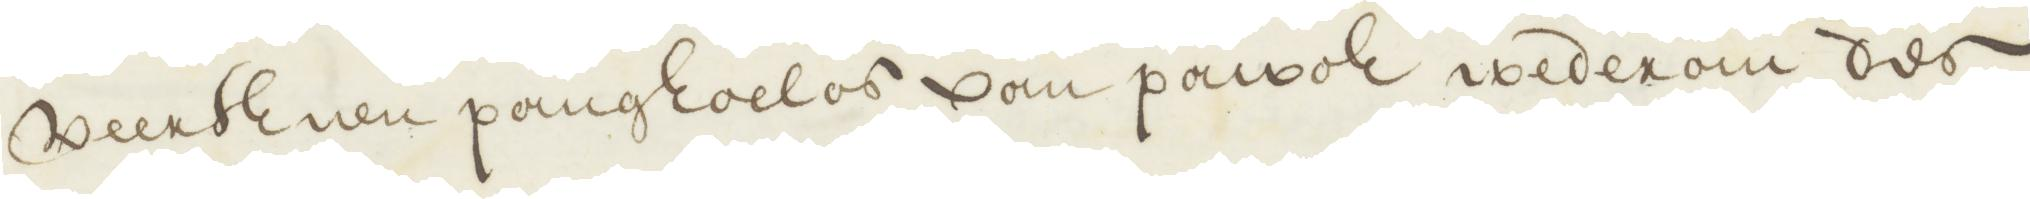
veerthien panghoelos van pawoh wederom des
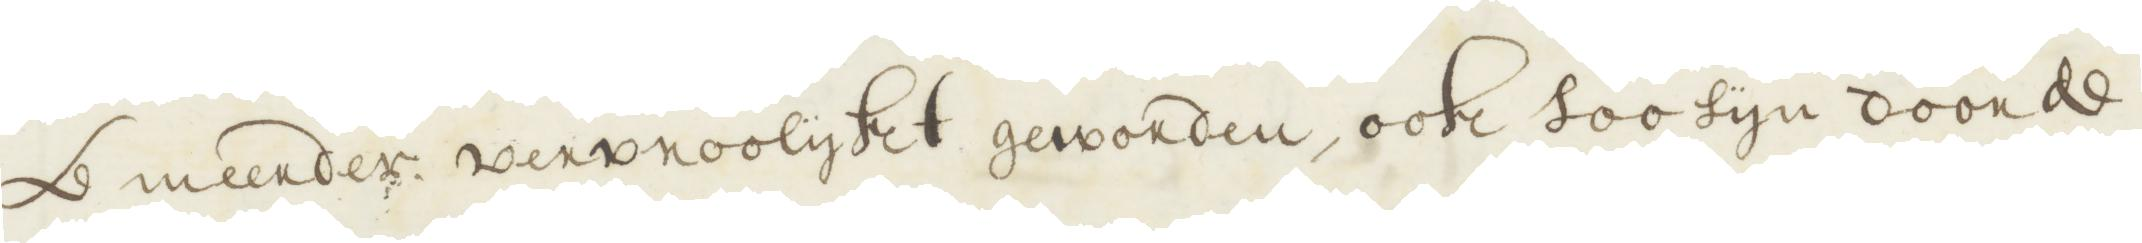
te meerder. vervroolijkt geworden, ook soo sijn door de
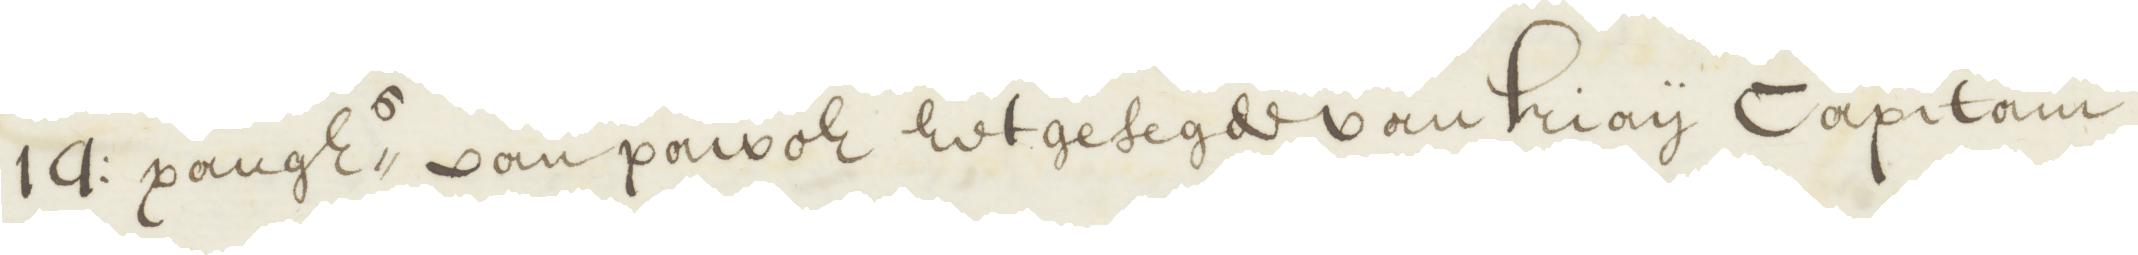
14: pangh„s van pawoh het gesegde van kiaij Capitain
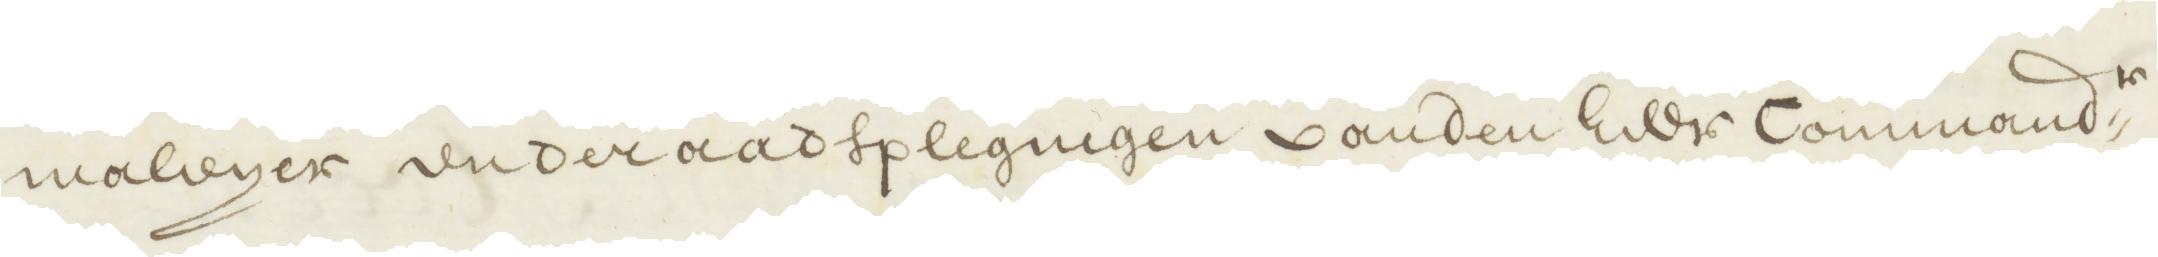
maleyer enderaadsplegingen vanden heer Command„r
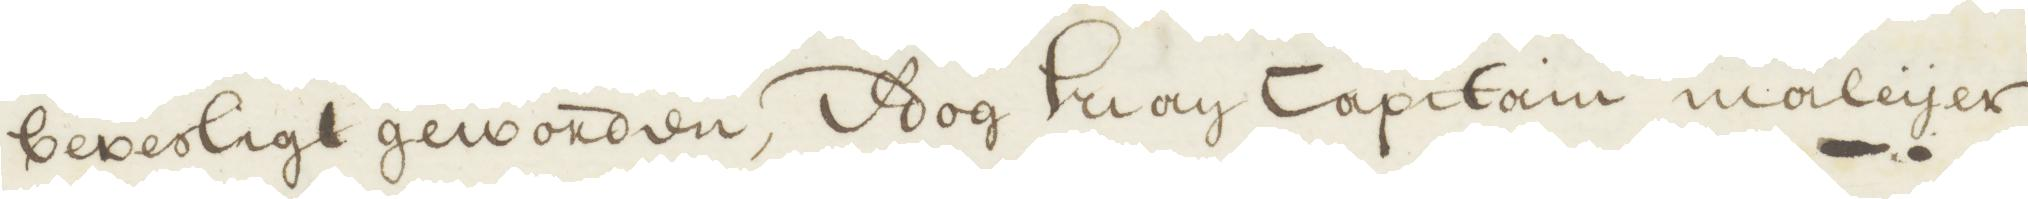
bevestigt geworden, Edog kiay Capitain maleijer
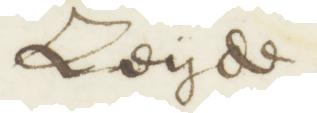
zeijde
